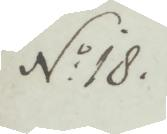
N:o 18.
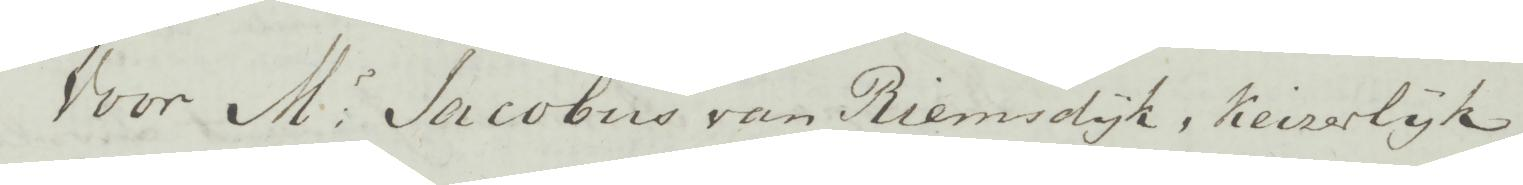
Voor M:r Jacobus van Riemsdijk, Keizerlijk
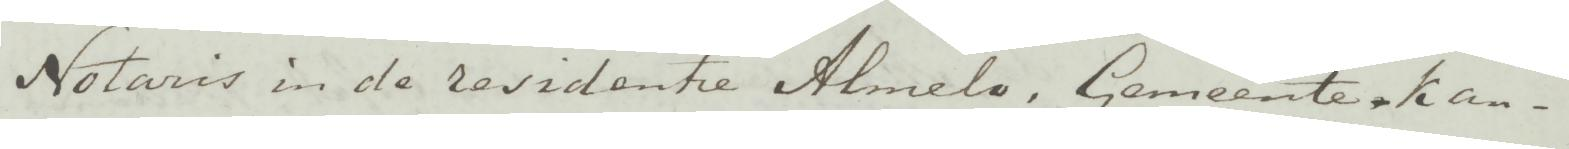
Notaris in de residentie Almelo, Gemeente , kan-
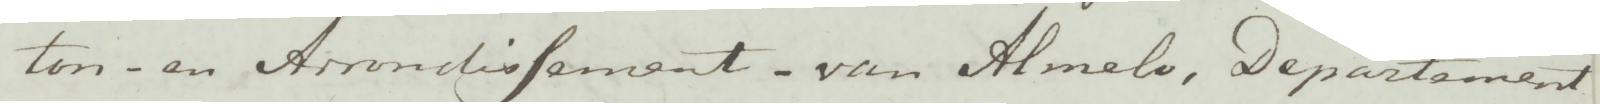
ten- en Arrondissement - van Almelo, Departement
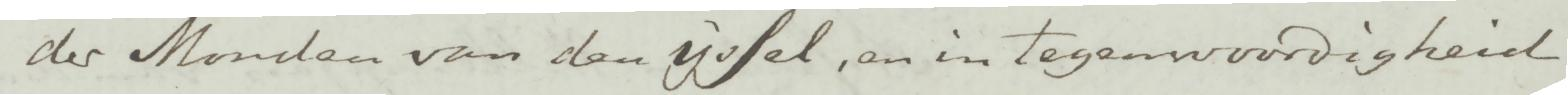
der Monden van den ijssel, en in tegenwoordigheid
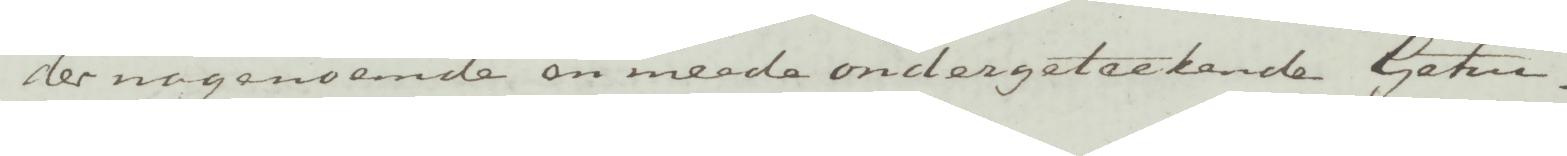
der nagenoemde en meede ondergeteekende Getui„
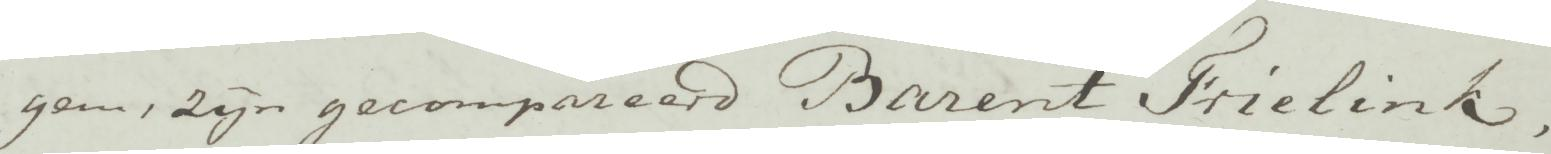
gen, zijn gecompareerd Barent Frielink,
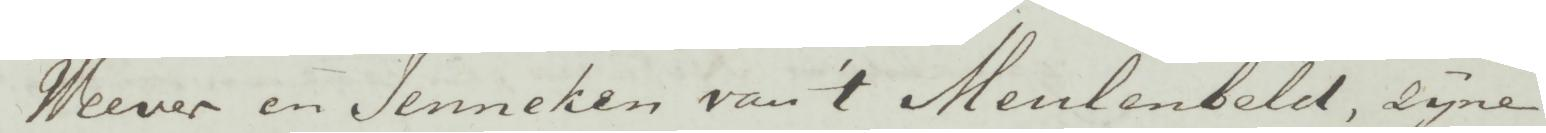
Weever en Jenneken van ’t Meulenbeld, zijne
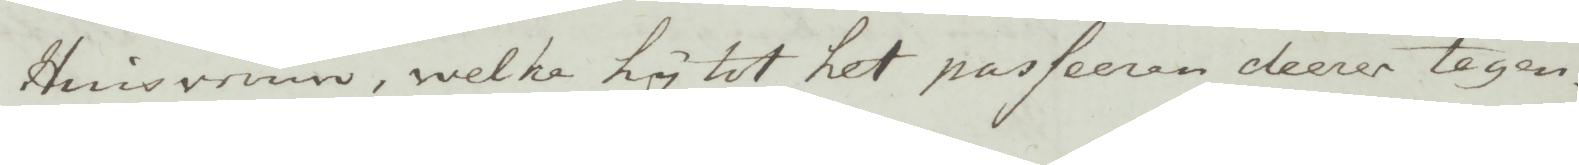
Huisvrouw, welke hij tot het passeeren deezer tegen
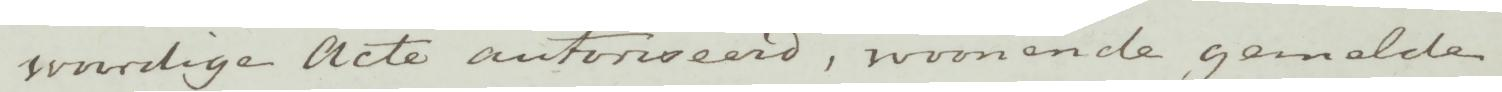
woordigen Acte autoriseerd, woonende gemelde
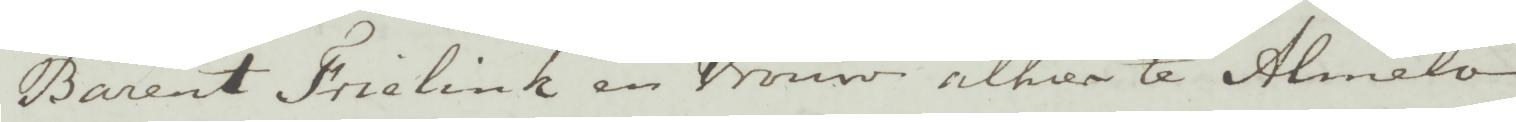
Barent Frielink en Vrouw alhier te Almelo
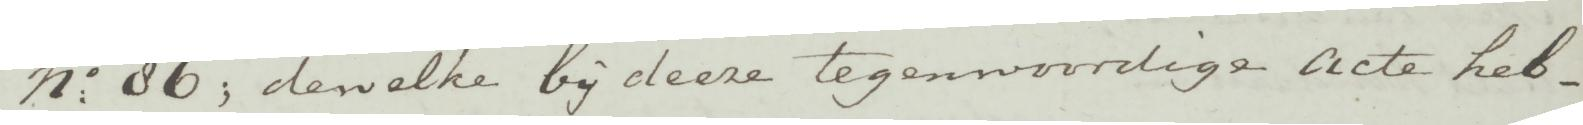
N:o 86; dewelke bij deeze tegenwoordige Acte heb„
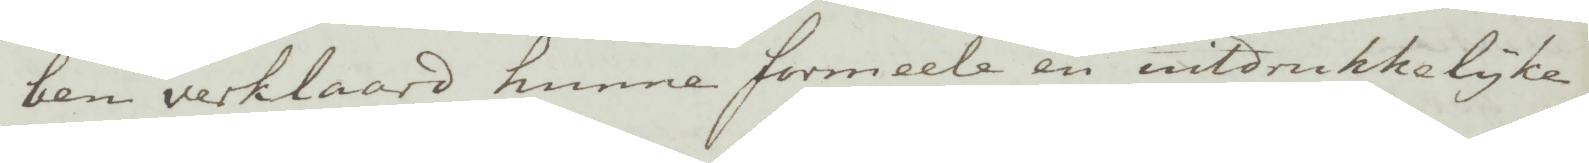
ben verklaard hunne formeele en uitdrukkelijke
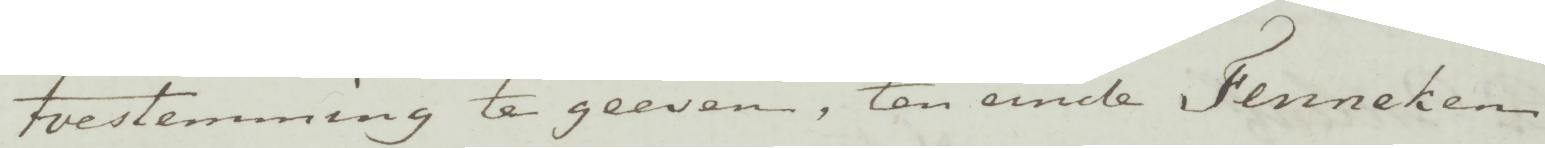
toestemming te geeven, ten einde Fenneken
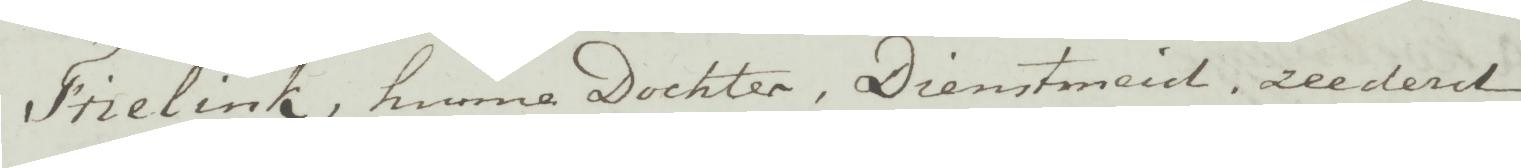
Frielink, hunne Dochter, Dienstmeid, zeederd
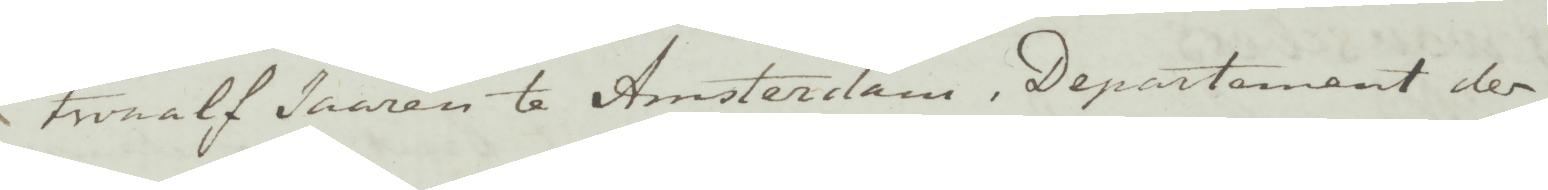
twaalf Iaaren te Amsterdam, Departement der
